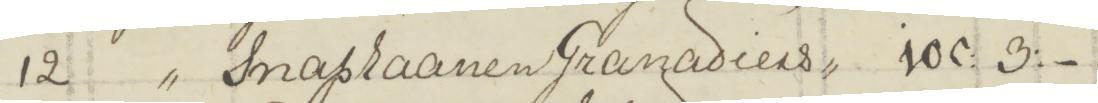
12 „ snaphaanen Granadiers„ 105:3:—
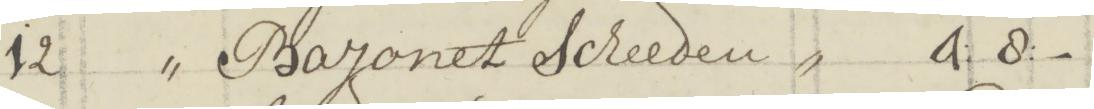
12 „ Bajonet Scheeden „ 4:8:—
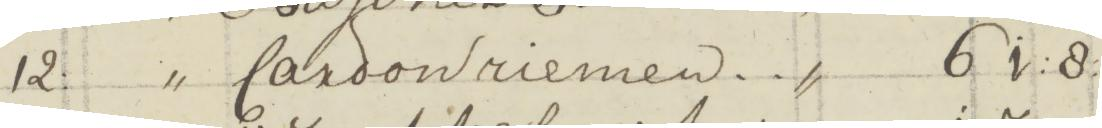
12: „ Cardon riemen . . „ 61:8:
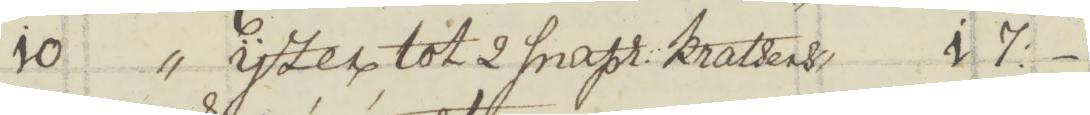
10 „ ijzer tot 2 snaph: kratsers„ 1 7:—
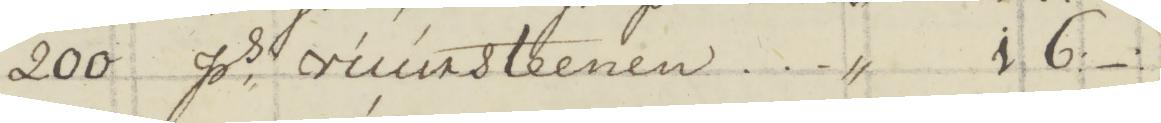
200 p„s vuursteenen . . - „ 1: 6:—:
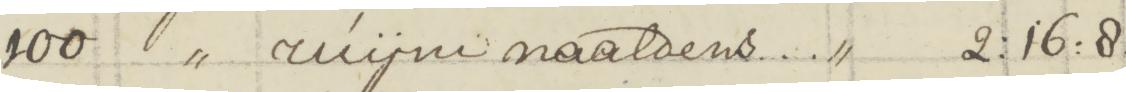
100 „ ruijm naaldens . . .„ 2: 16: 8
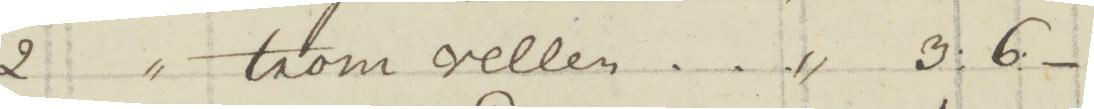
2 „ trom vellen . . . „ 3: 6:—
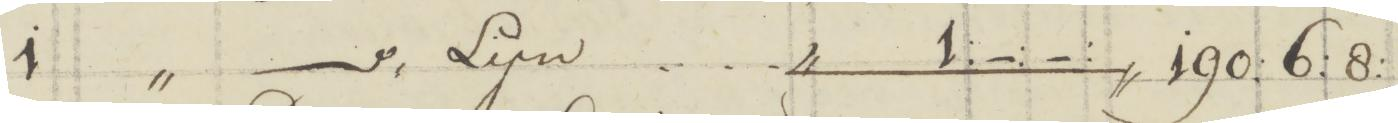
1 „ _„o Lijn . . .„ 1:—:—: „ 190: 6: 8:
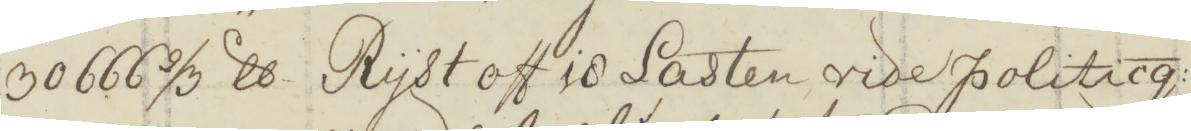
30666 2/3 lb. Rijst off 18 Lasten vide politicq:
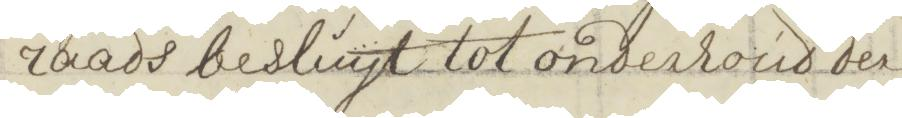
raads besluijt tot onderhoud der
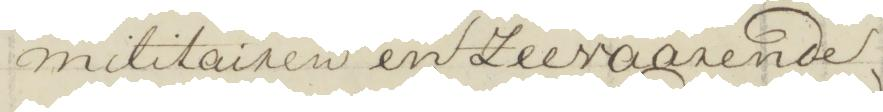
militairen en zeevaarende
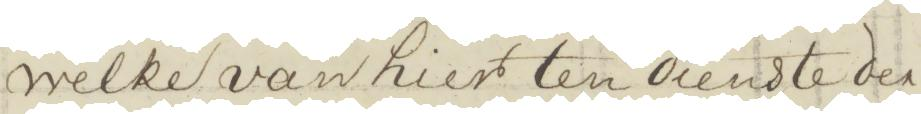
welke van hier ten dienste der
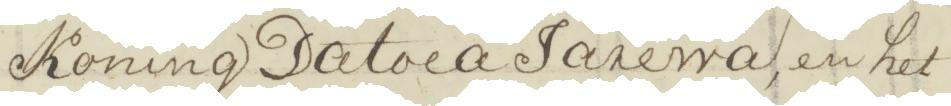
Koning Datoea Iarewa, en het
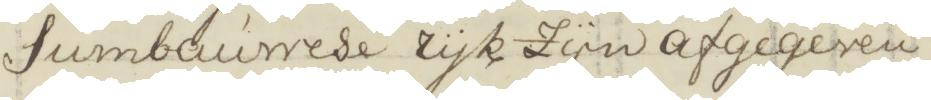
sumbauwese rijk zijn afgegeven
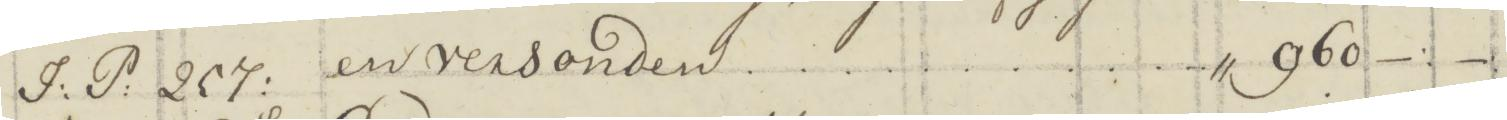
I: P: 257: en versonden . . . . . . . . . . -„ 960:—:—:
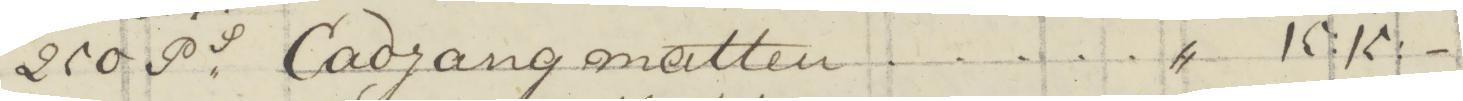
250 P„s Cadjang matten . . . . .„ 15:15:—
